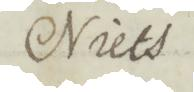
Niets
